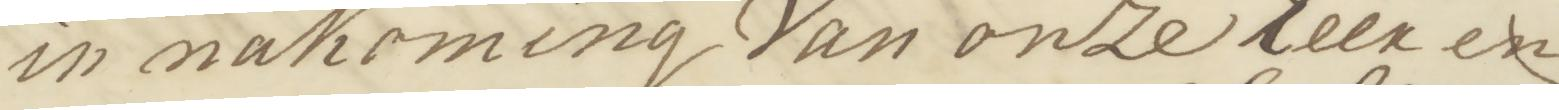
in nakoming van onze heer en
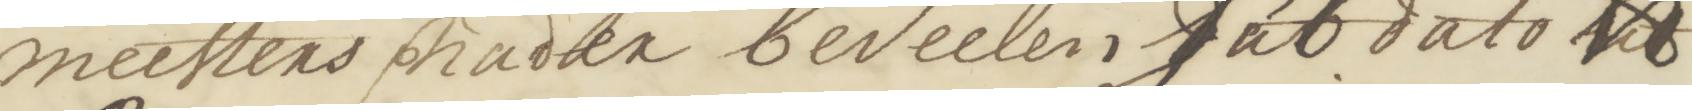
meesters nader beveelen, sub dato 18
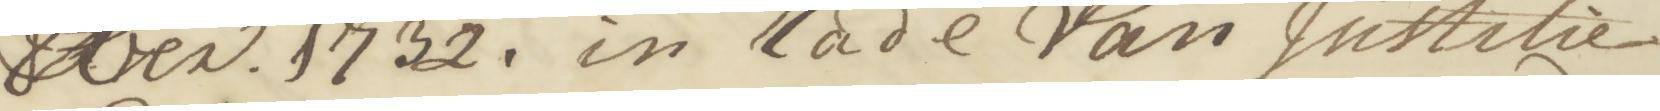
8ber. 1732. in rade van justitie
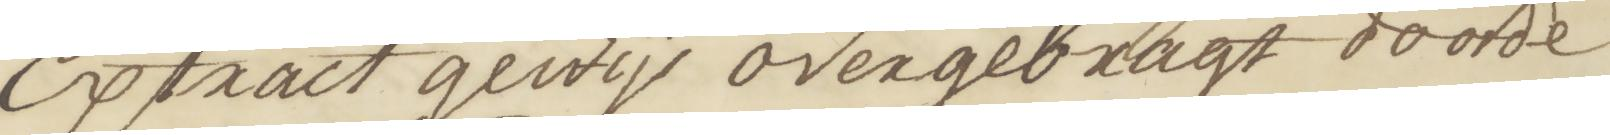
Extract gewijs overgebragt doorde
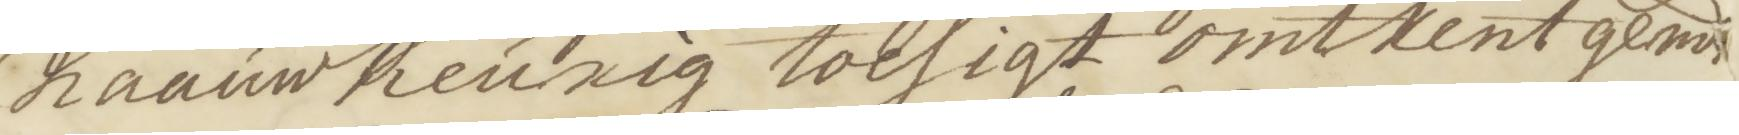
nauwkeurig toesigt omtrent gem.
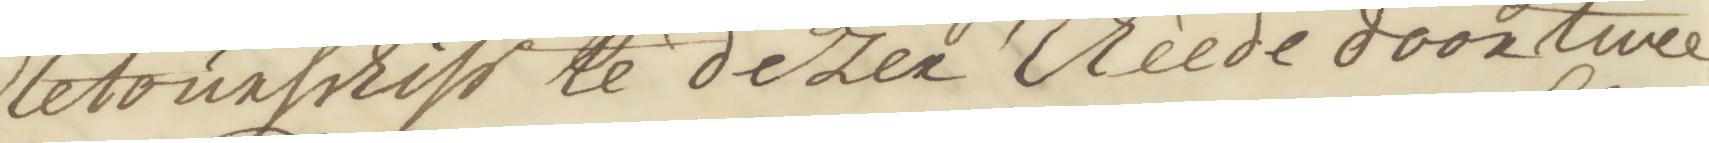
retourschip te dezer rheede door twee
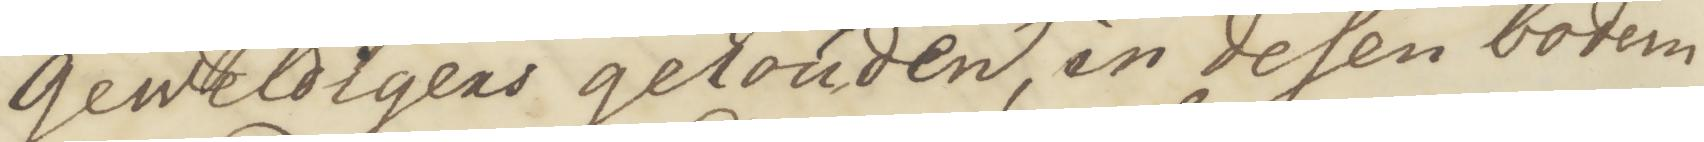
geweldigers gehouden, in desen bodem
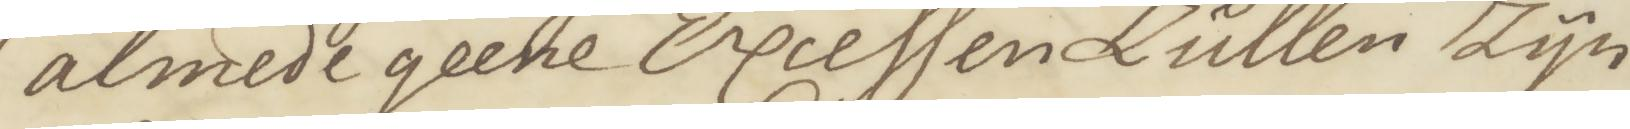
almede geene Excessen zullen zijn
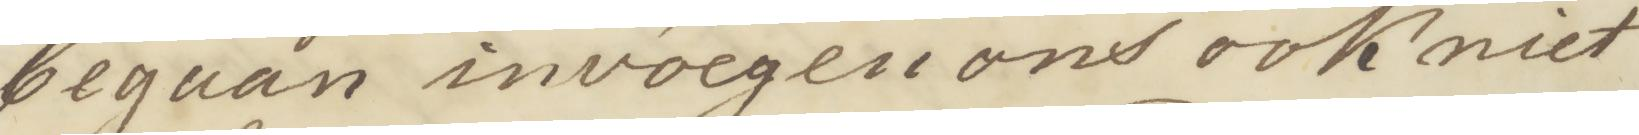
begaan invoegen ons ook niet
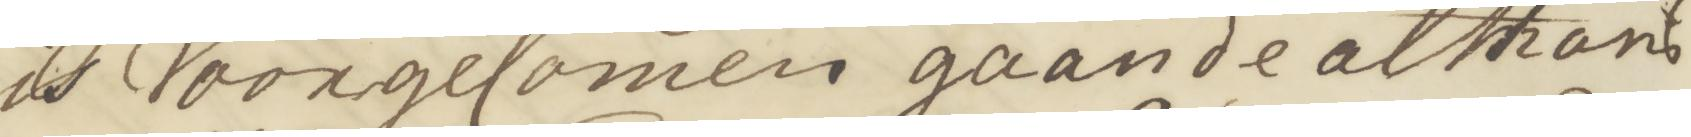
is voorgecomen gaande althans
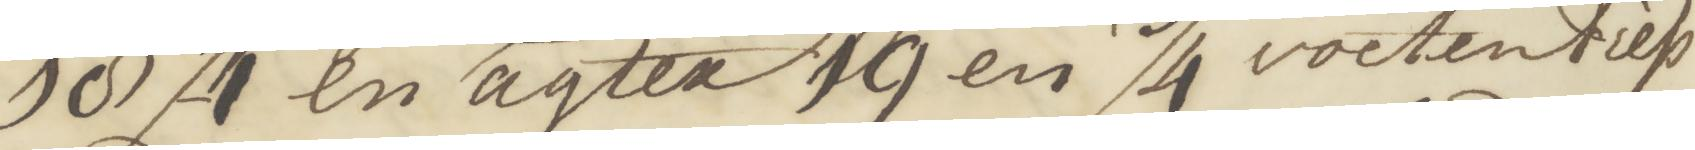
18¼ en agter 19 en ¾ voeten diep
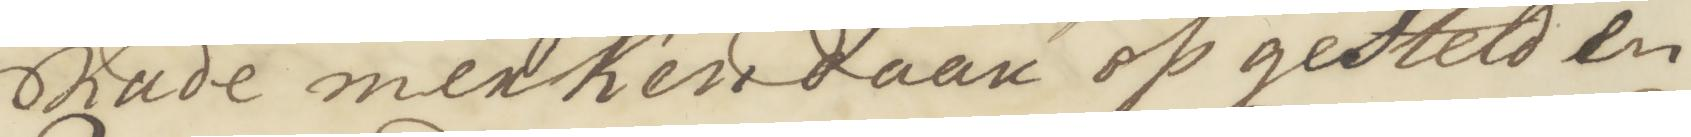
nade merken daar op gesteld en
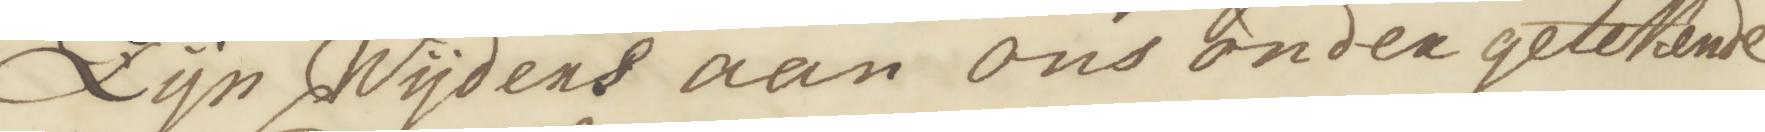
zijn wijdens aan ons onder getekende
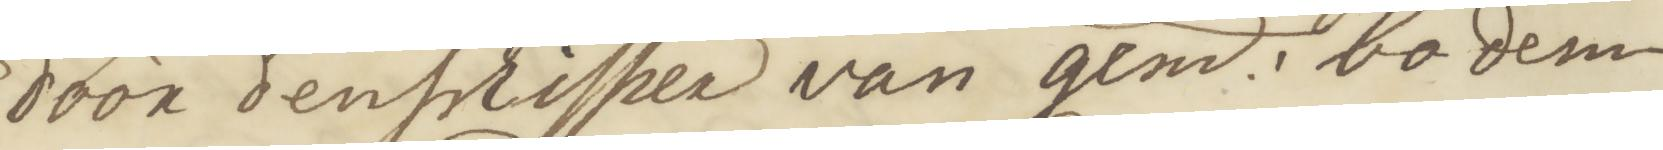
door den schipper van gem: bodem
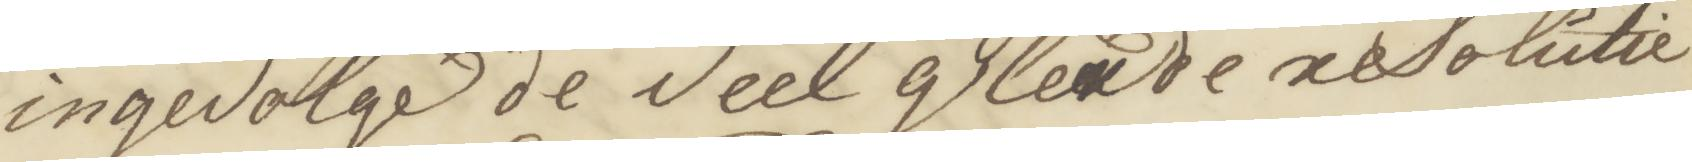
ingevolge de veel g'Eerde resolutie
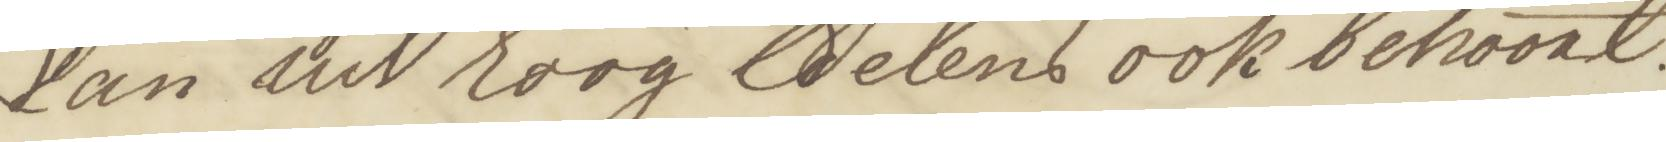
van uw hoog Edelens ook behoorl:
